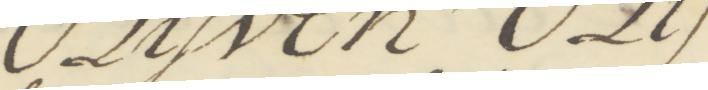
Olijven Olij
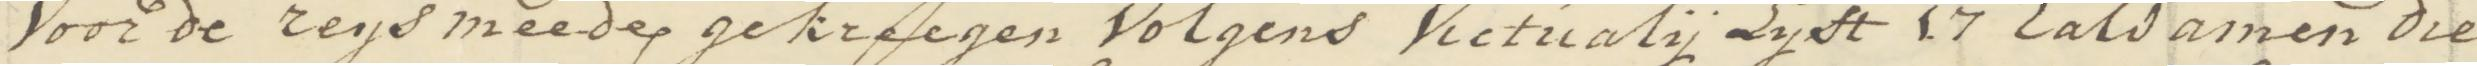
Voor de reijs meede gekreegen volgens victualij Lyst 17 halsamen die
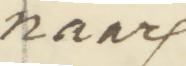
naaren
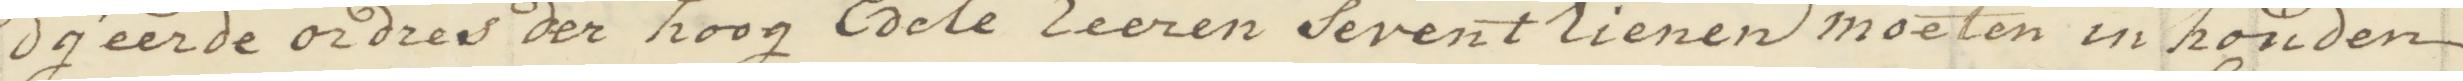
d g'eerde ordres der hoog Edele heeren seventhienen moeten in houden
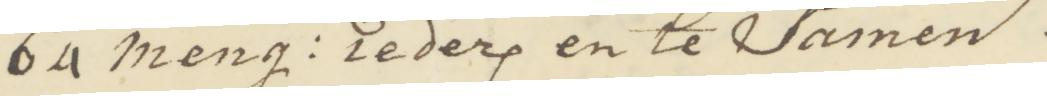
64 meng:n ieder en te samen
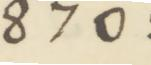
870 :
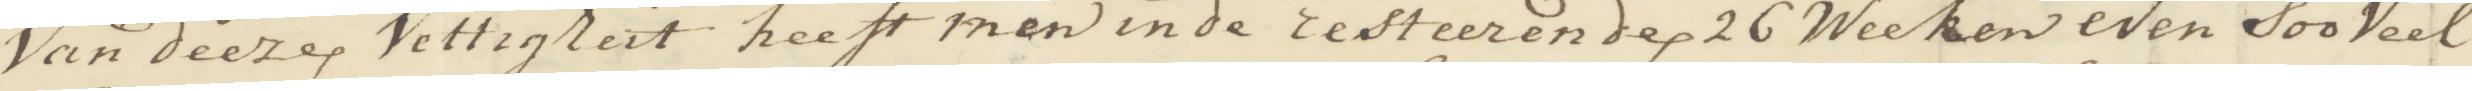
van deeze vettigheit heeft men in de resteerde 26 weeken even soo veel
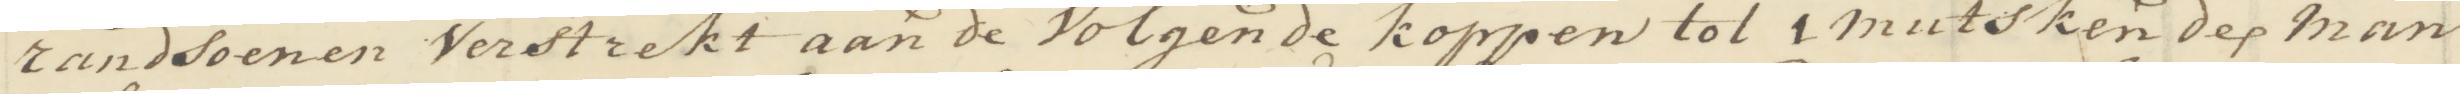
randsoenen verstrekt aan de volgende koppen tot 1 mutsken de man
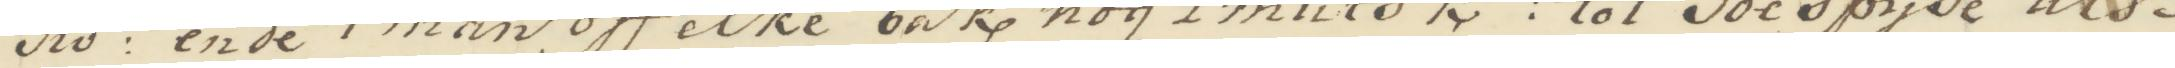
sio:ks ende 7 man off elke bak nog 2 mutsk:=ns tot Toespyse als
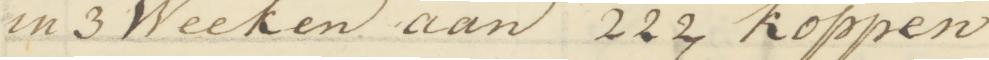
in 3 weeken aan 222 koppen
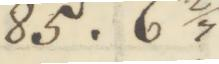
85. 6 2/4
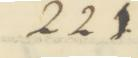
221
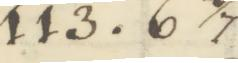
113. 6 4/7
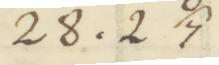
28. 2 6/7
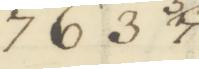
763 5/7
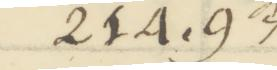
214. 9 5/7
